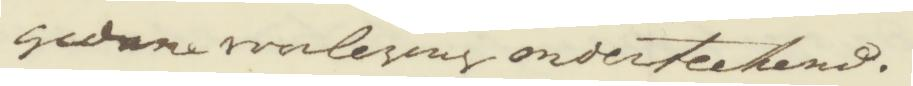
gedane voorlezing onderteekend.
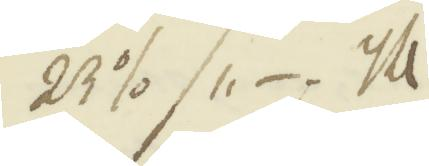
23% „ —. 74
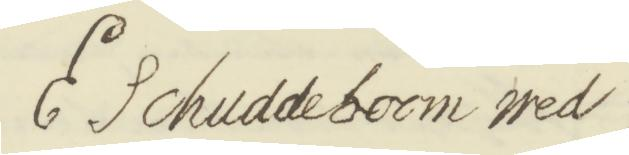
E Schuddeboom wed
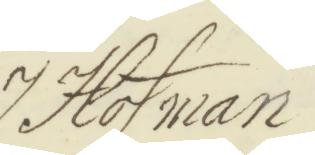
J Hofman
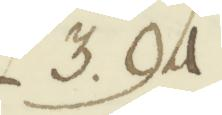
ƒ 3.94
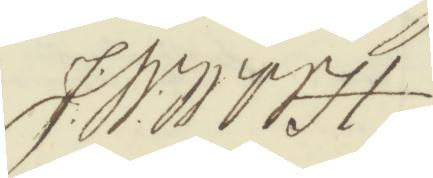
J:W: Worst
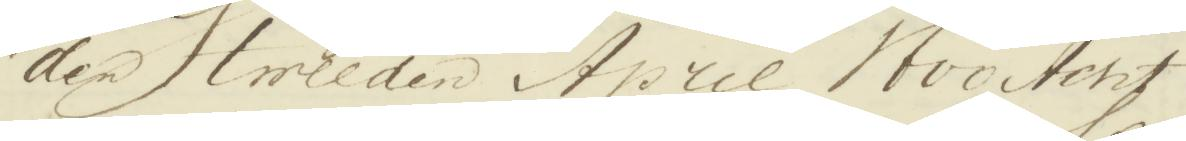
den tweeden April 1800 Acht
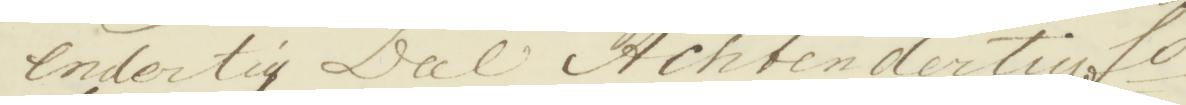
endertig Deel Achtendertig fo
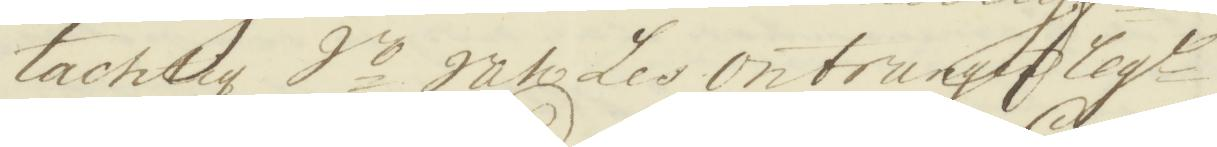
tachtig V=o vak Zes ontvangen Reg=e
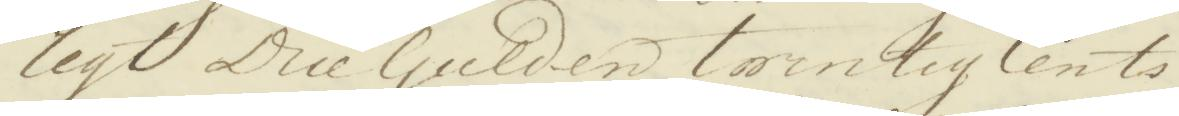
Regt Drie Gulden twintig Cents
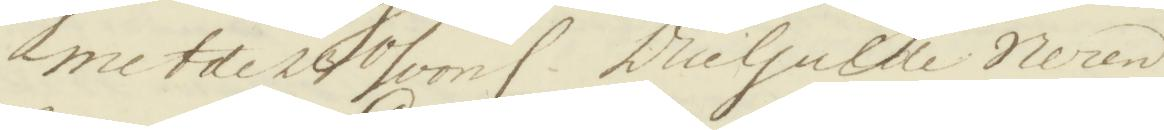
met de 23% opC DrieGulden Vieren
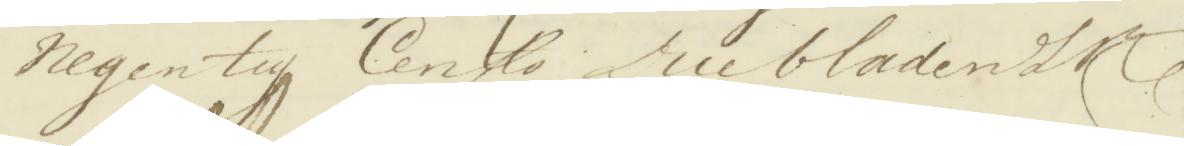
negentig Cents drie bladen ZR
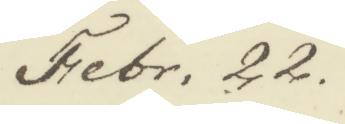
Febr, 22.
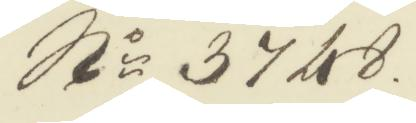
N=o 3748.
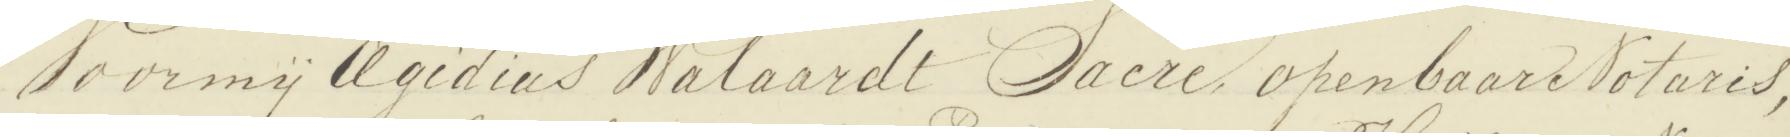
Voor mij AEgidius Walaardt Sacré, openbaar Notaris
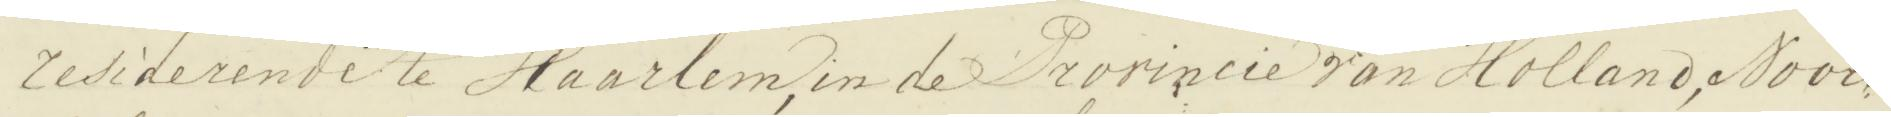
residerende te Haarlem, in de Provincie van Holland, Noor„
